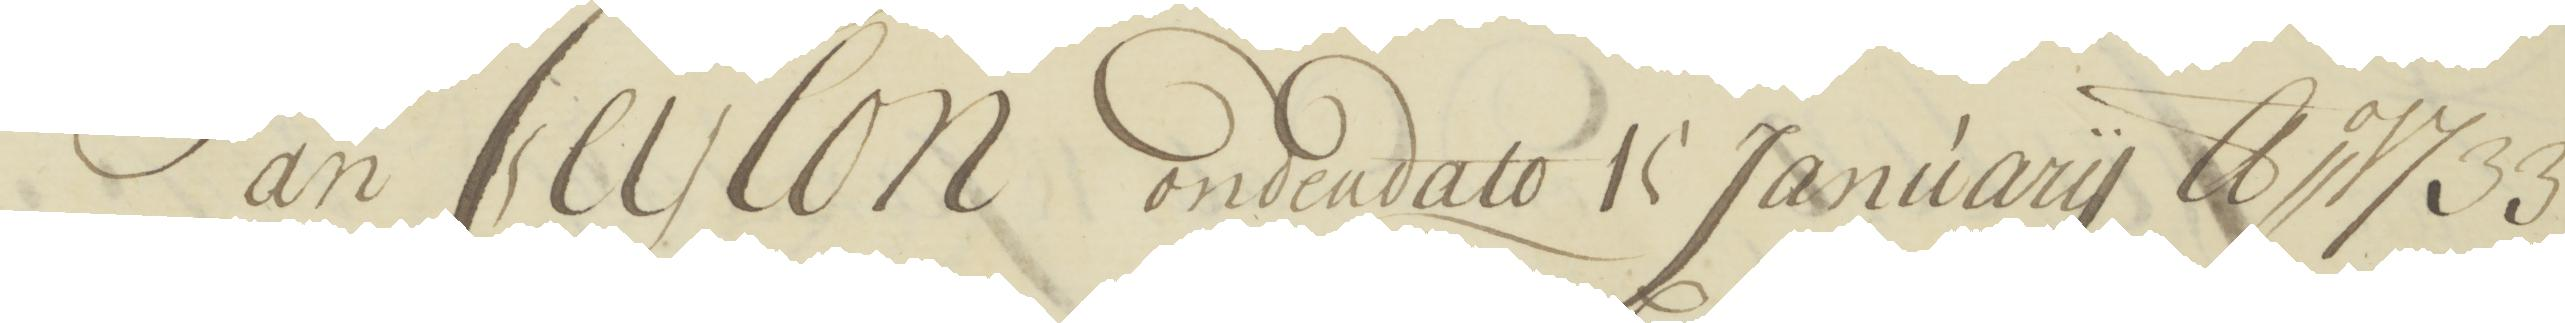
Van Ceijlon onder dato 15 Januarij A„o 1733
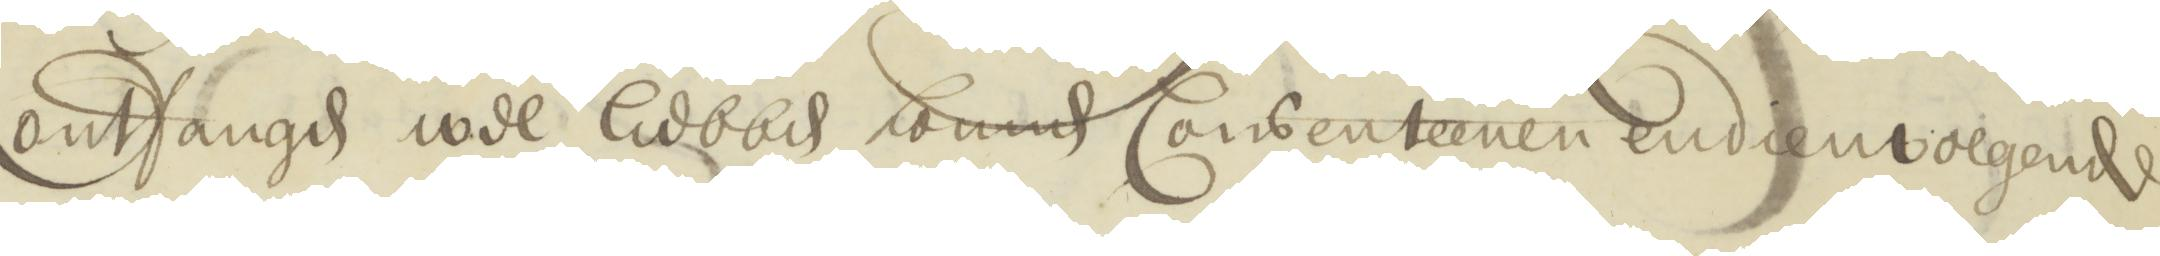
ontfangen wel hebben konnen Consenteeren endien volgende
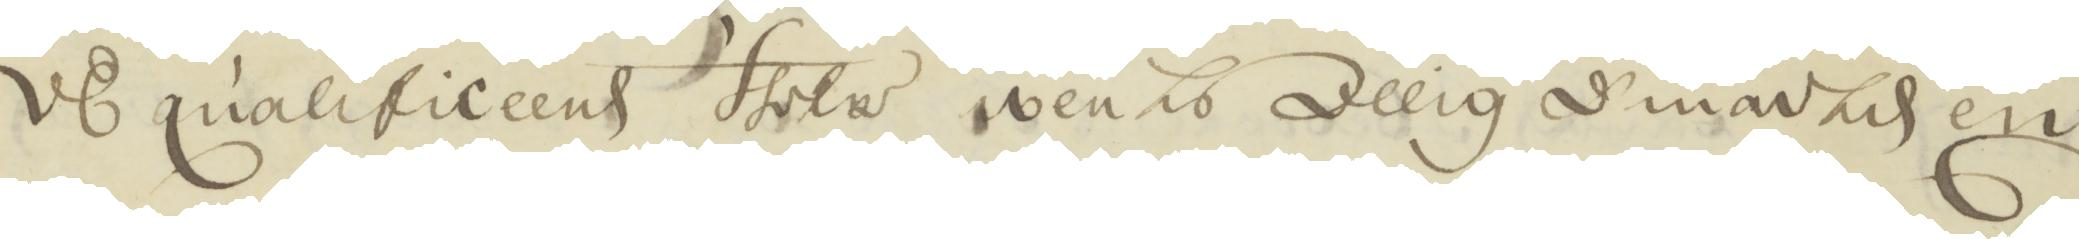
vE qualificeeren 't selve werk stellig te maeken en
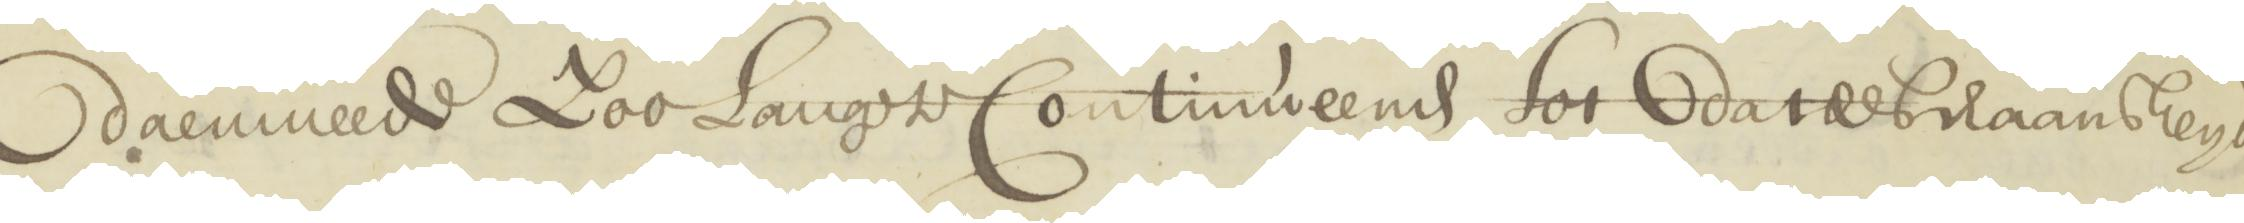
daermeede Zoo Lange te Continueeren tot dat de schaarsheyd
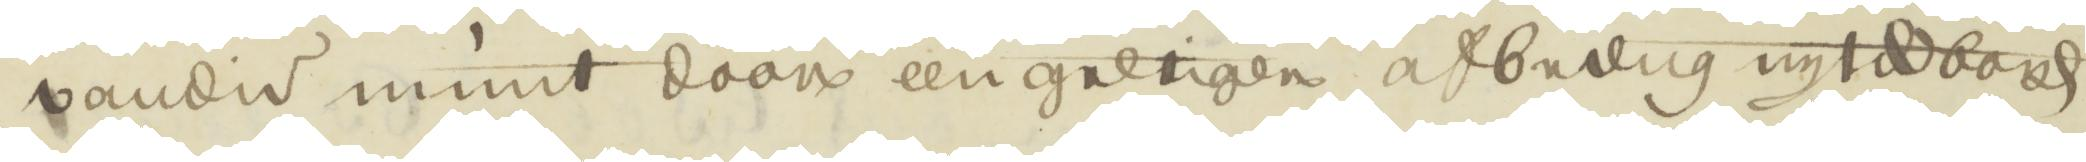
van die munt door een gretiger afbreng uyt de boven
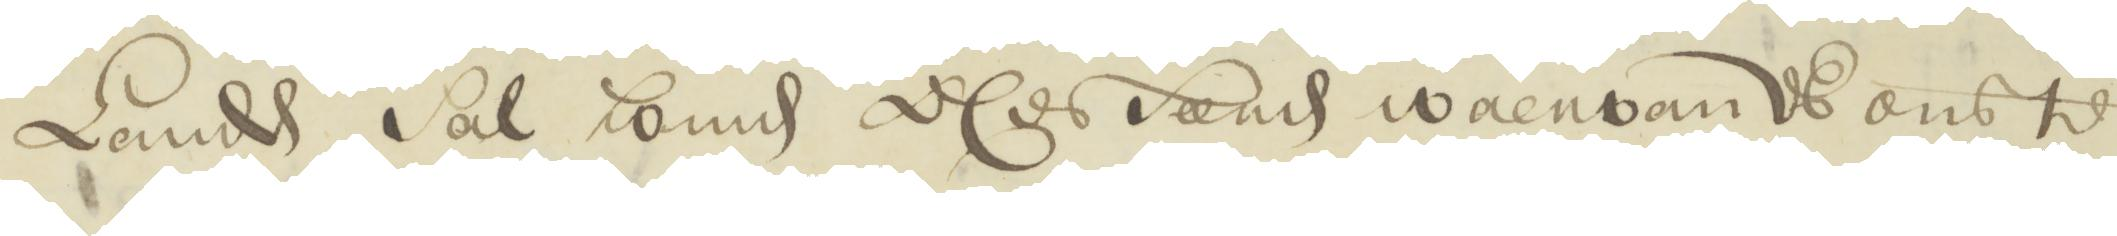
Landen Sal komen te Cesseeren waervan VE ons te
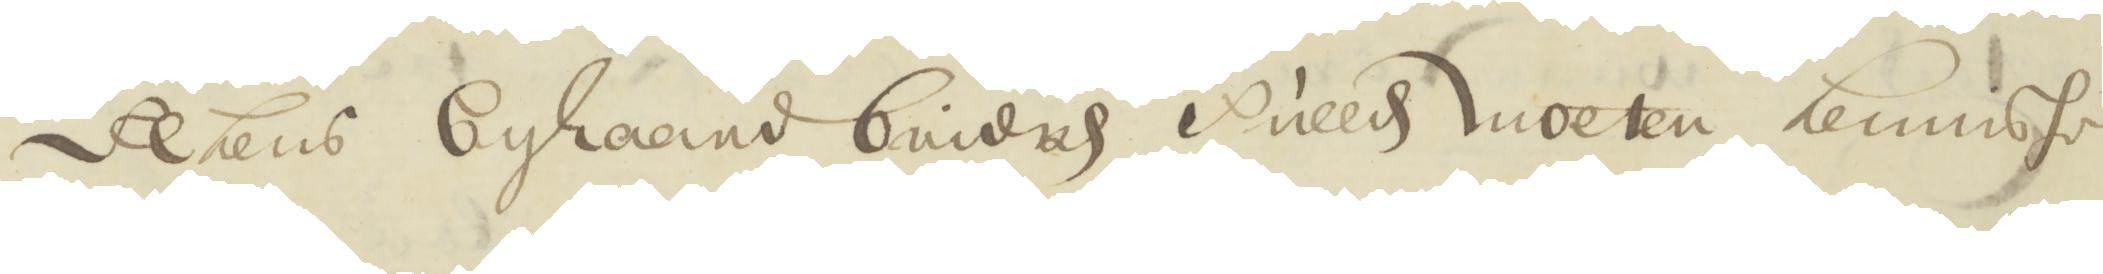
Elkens by haare brieven sullen moeten kennisse
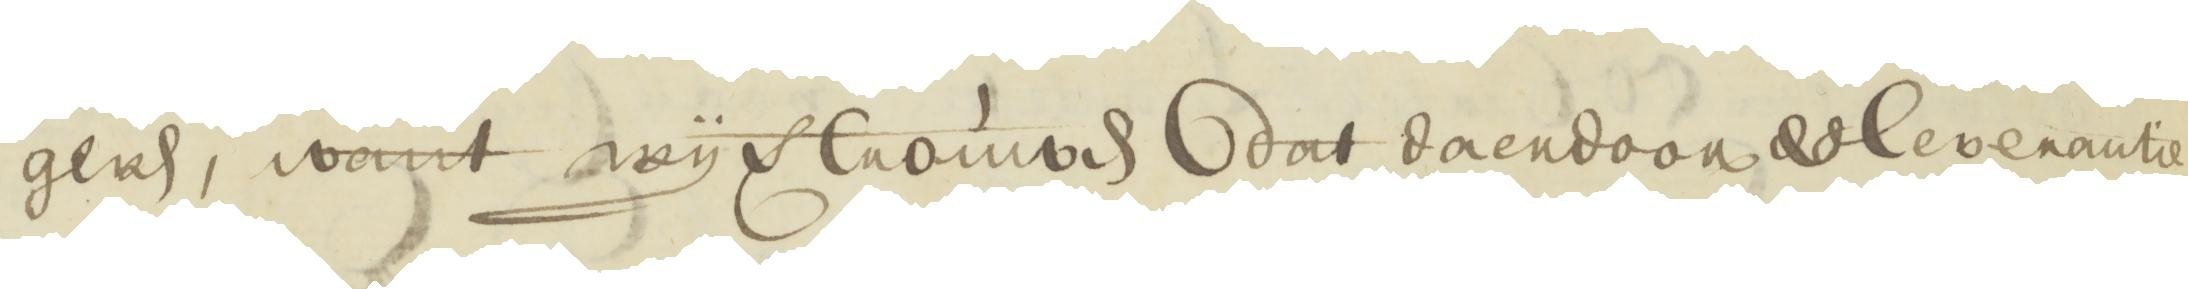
geven, want wij vertrouwen dat daerdoor de leverantie
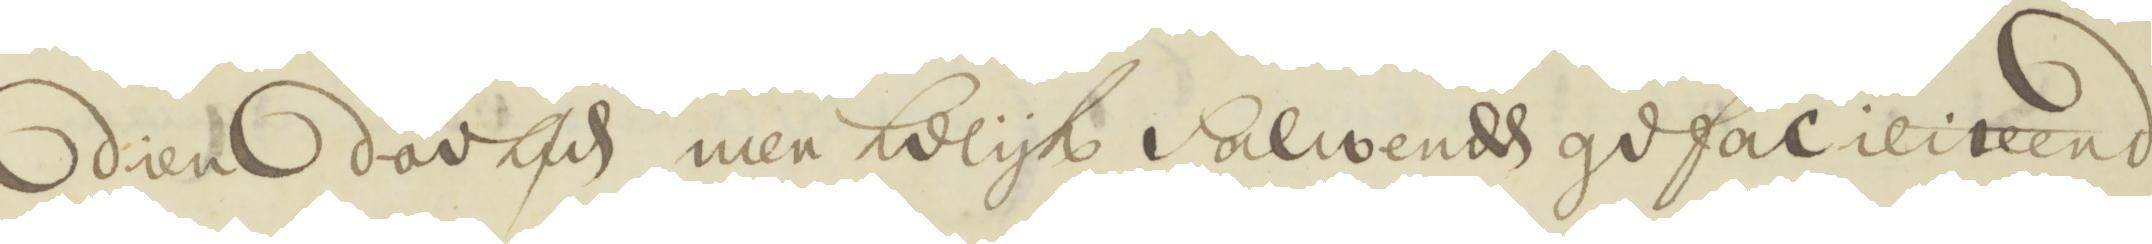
dier doeken merkelijk Sal werden gefaciliteerd
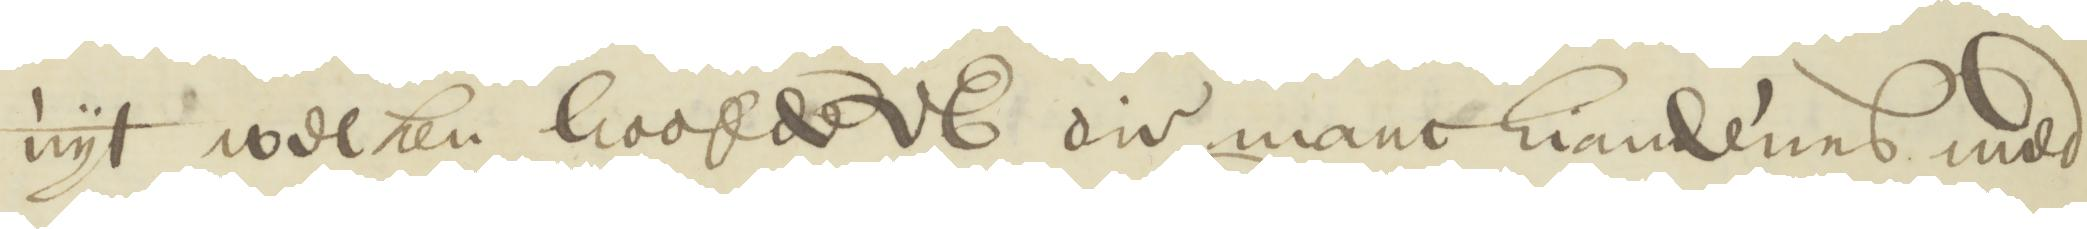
uijt welken hoofde VE: die marchiandeurs med
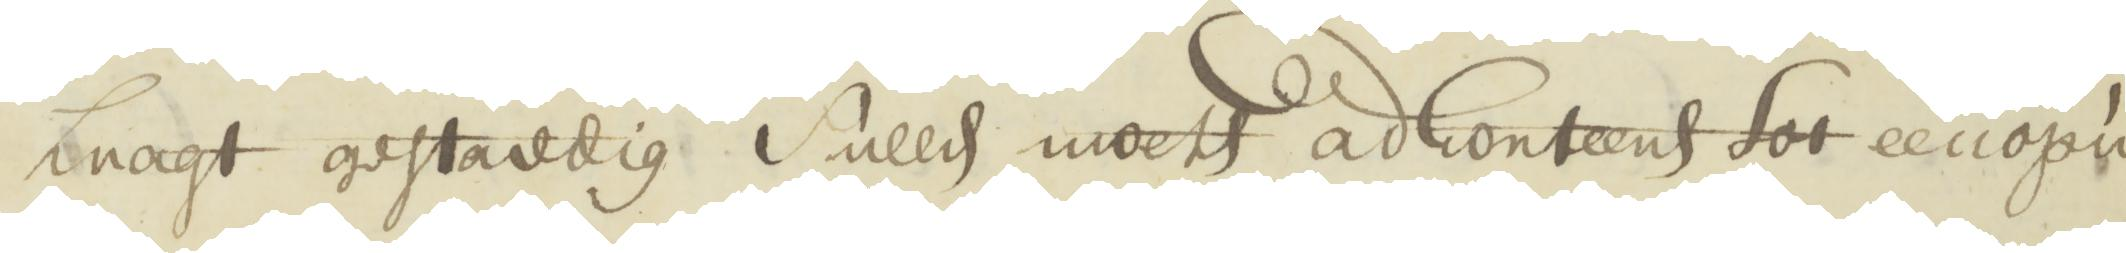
kragt gestaedig Sullen moeten adhorteenen tot een opu
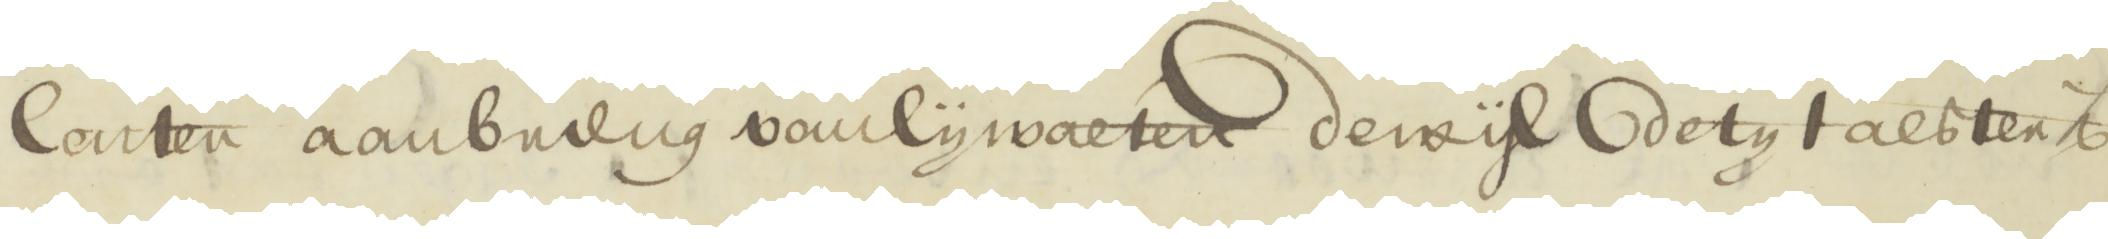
lenter aanbreng van lijwaeten dewijl de tyt al sterk
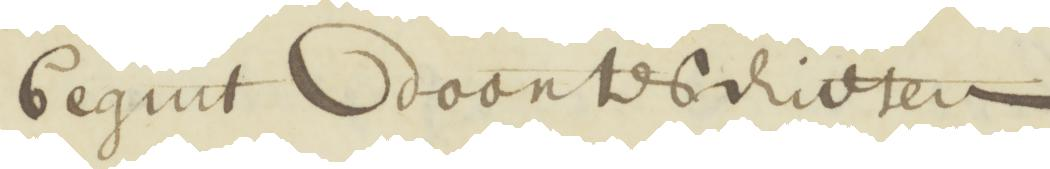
begint door te schieten
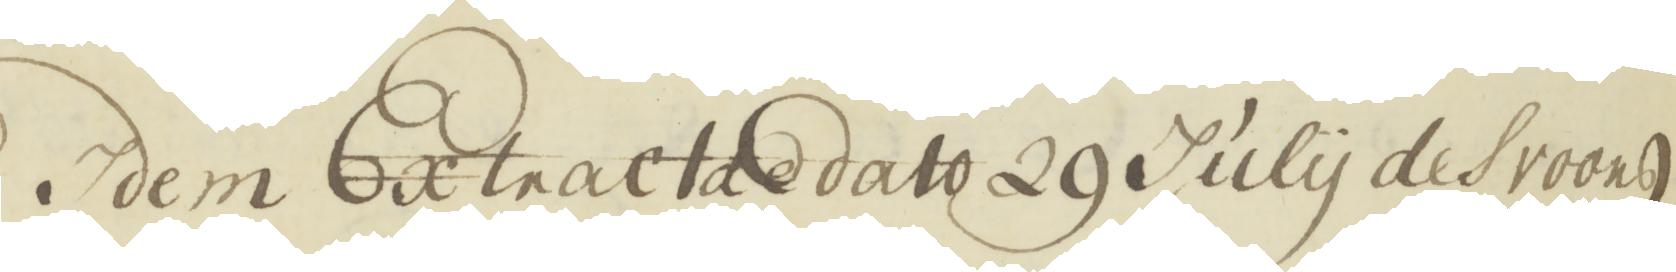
Idem Extracta dato 29 Iulij des voors
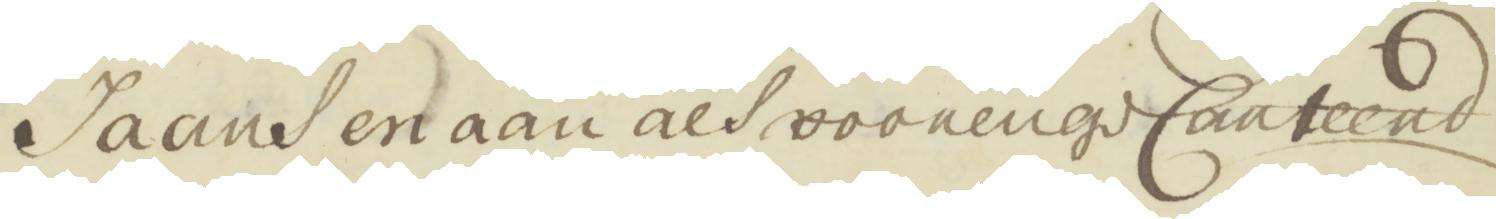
Iaars en aan als vooren gecarteerd
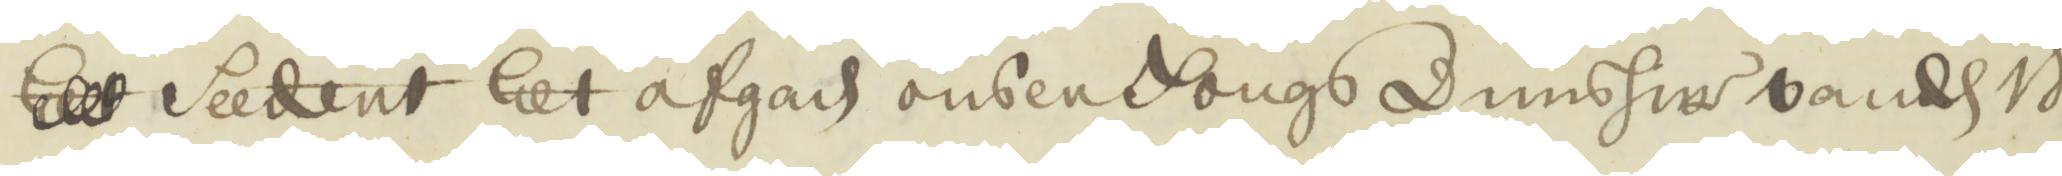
het Seedert het afgaen onser Iongste missive vanden 18
